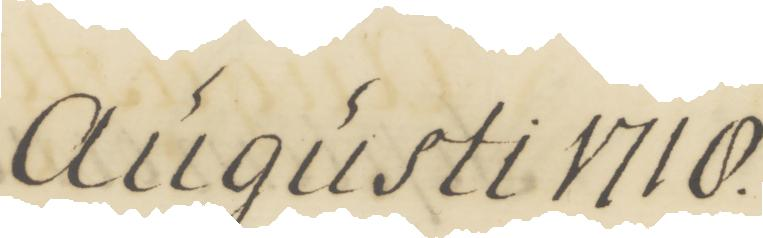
Augusti 1718.
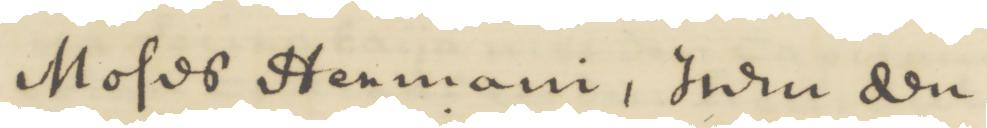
Moses Hermani, Item den
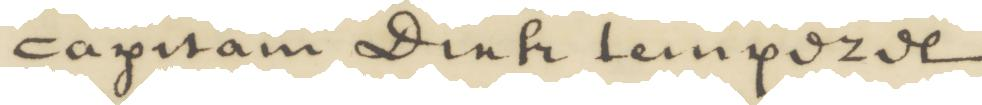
capitain Dirk tempezel
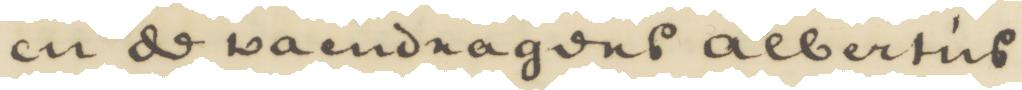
en de vaendragers Albertus
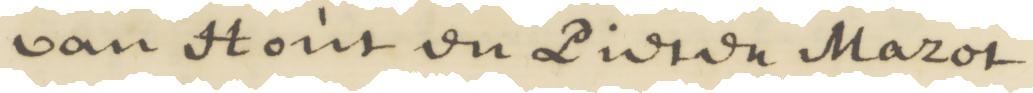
van Hout en Pieter Mazot
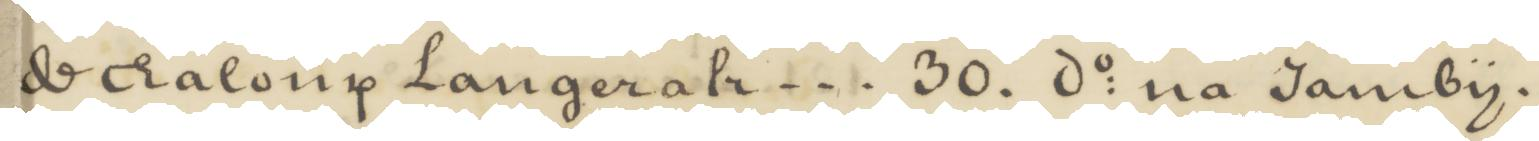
de chaloup Langerak - - - 30. d:o na Jambij.
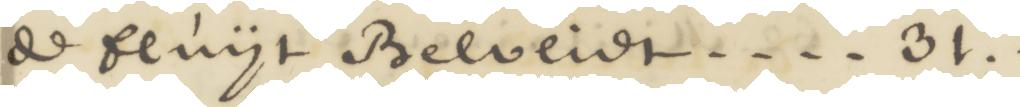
de fluijt Belvliet - - - - 31.
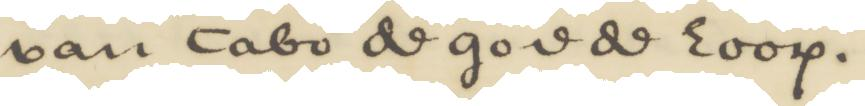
van Cabo de goede hoop.
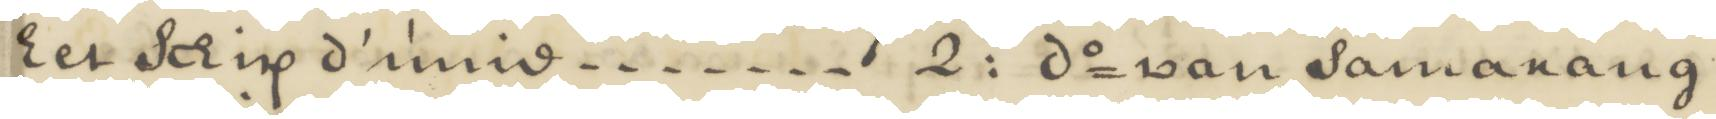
het schip d’unie - - - - - - - 2: d=o van Samarang
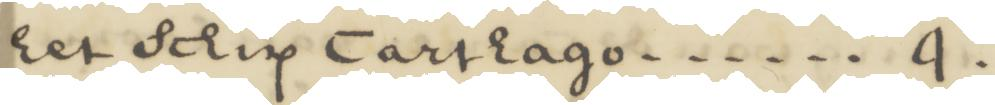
het schip Carthago - - - - - - 4.
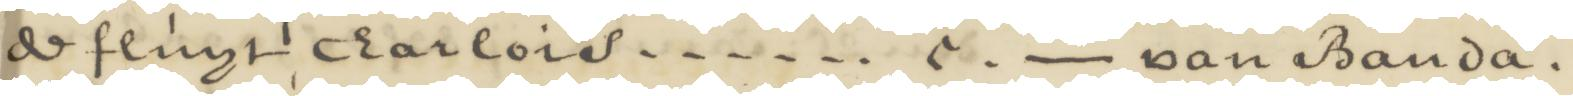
de fluijt charlois - - - - - - 5. — van Banda.
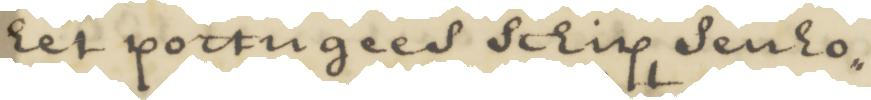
het portugees schip senho„
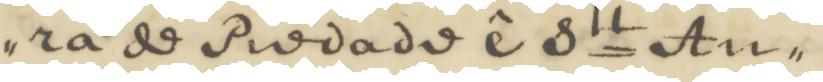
„ra de Piedade ê S=t An„
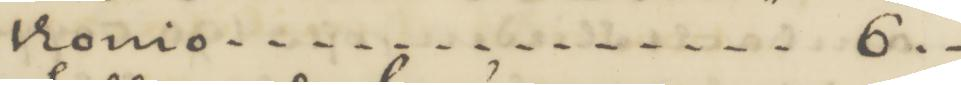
thonio - - - - - - - - - - - - - - 6.
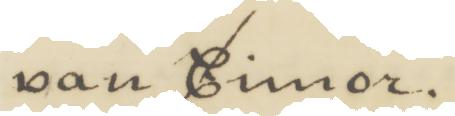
van Timor.
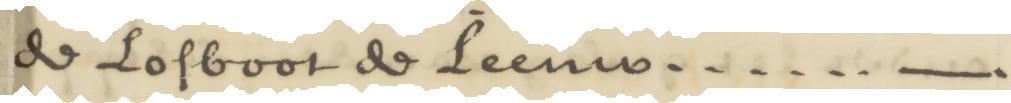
de Losboot de Leeuw - - - - - - —.
